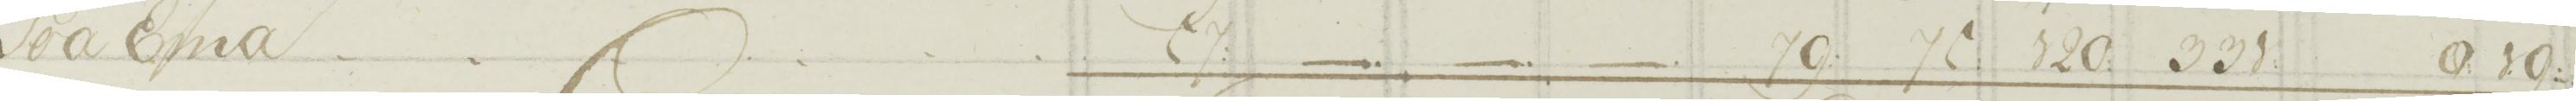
Soa Ema - - - - - - 57: —. —. —. 79: 75: 120: 331: 8: 19:.
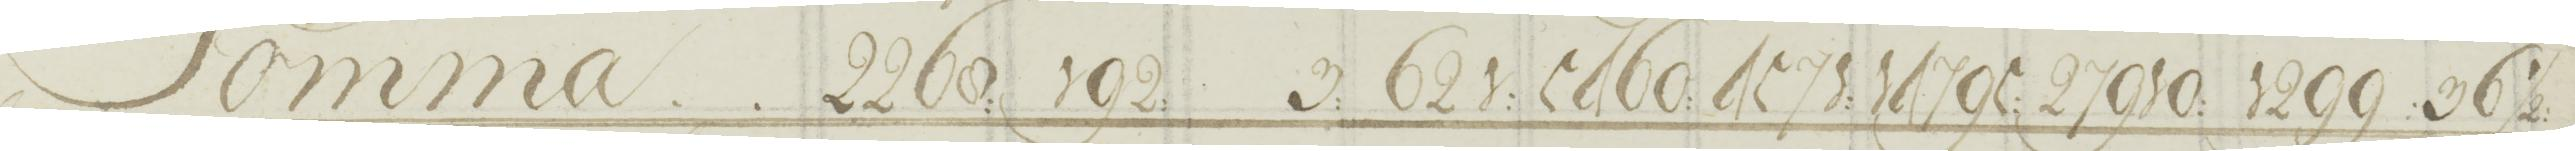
Somma . . 2268: 192: 3: 621: 5460: 4571: 14795: 27910: 1299: 36½:
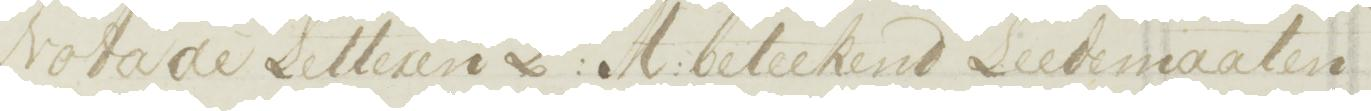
Nota de Letteren L: M: beteekend Leedemaaten
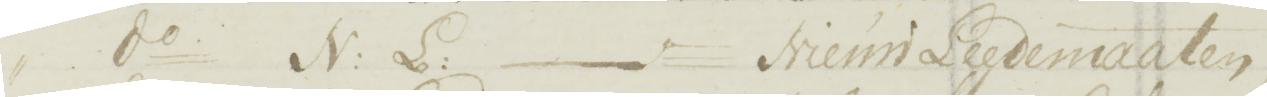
„ d=o N: L: _=o Nieuw Leedemaaten
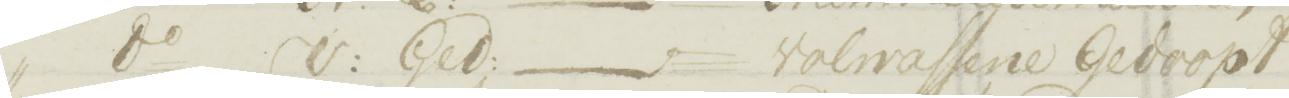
„ d=o V: Ged: _=o Volwassene Gedoopt
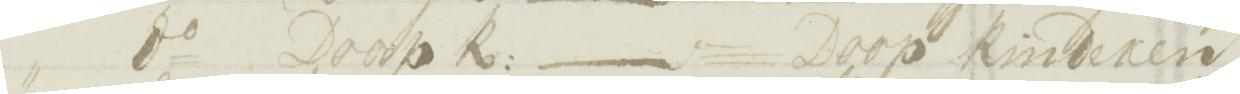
„ d=o Doop k: _=o Doop Kinderen
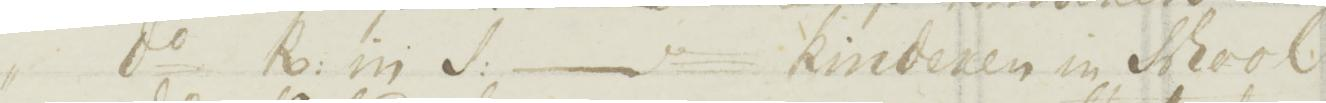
„ d=o k: in s: _=o kinderen in school
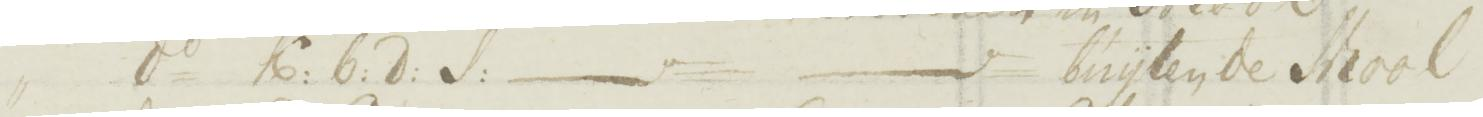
„ d=o K: b: d: s: _=o buijten de Shool
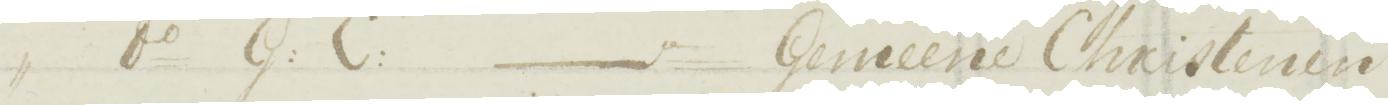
„ d=o G: C: _=o Gemeene Christenen
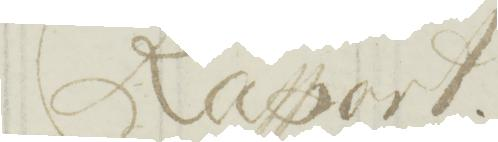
Rapport.
